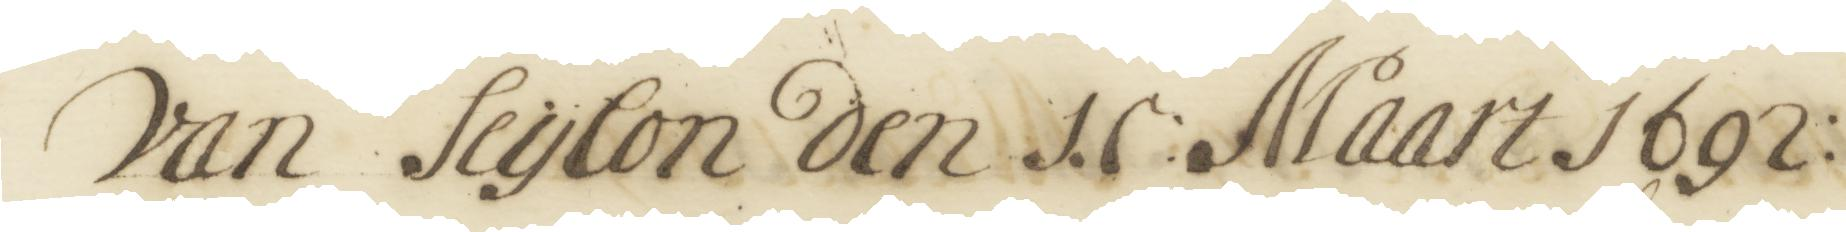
Van Seijlon den 15: Maart 1692:
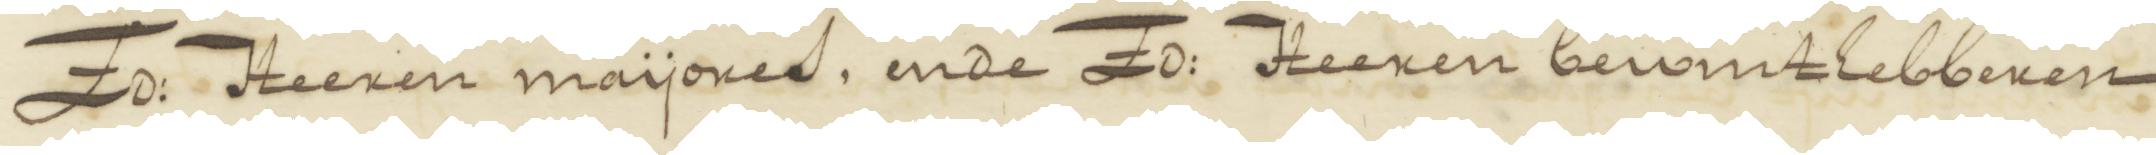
Ed: Heeren maijores, ende Ed: Heeren bewinthebberen
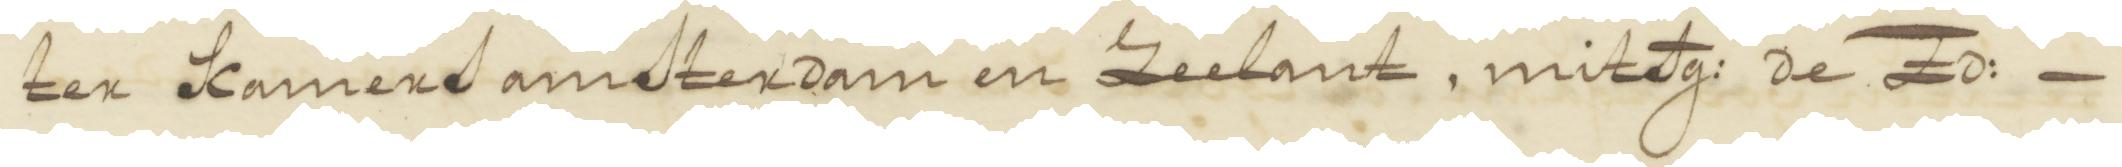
ter kamers amsterdam en zeelant, mitsg: de Ed: —
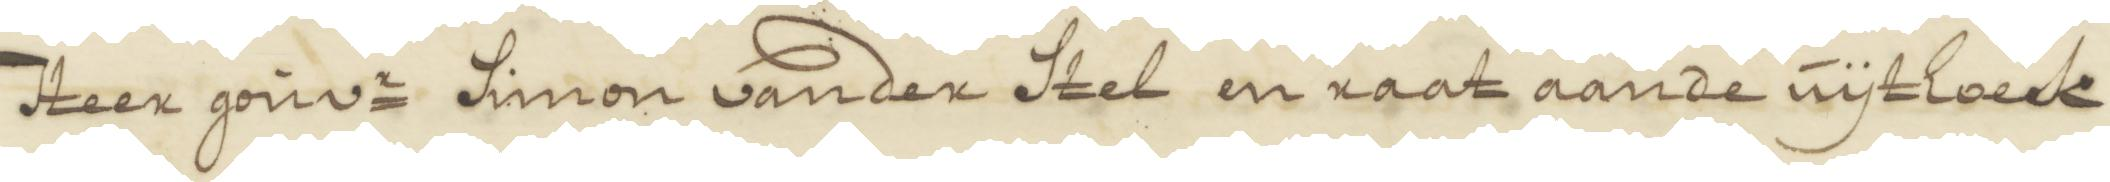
Heer gouv=r Simon van der stel en raat aan de uijthoeck
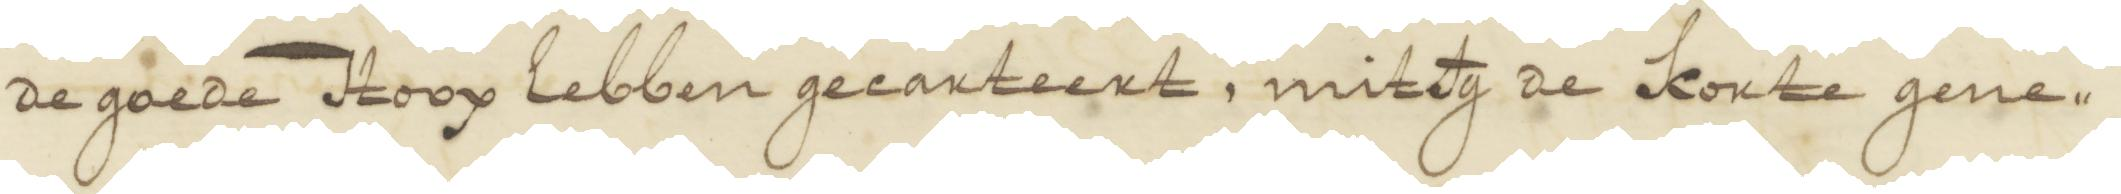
de goede Hoop hebben gecarteert, mitsg de korte gene„
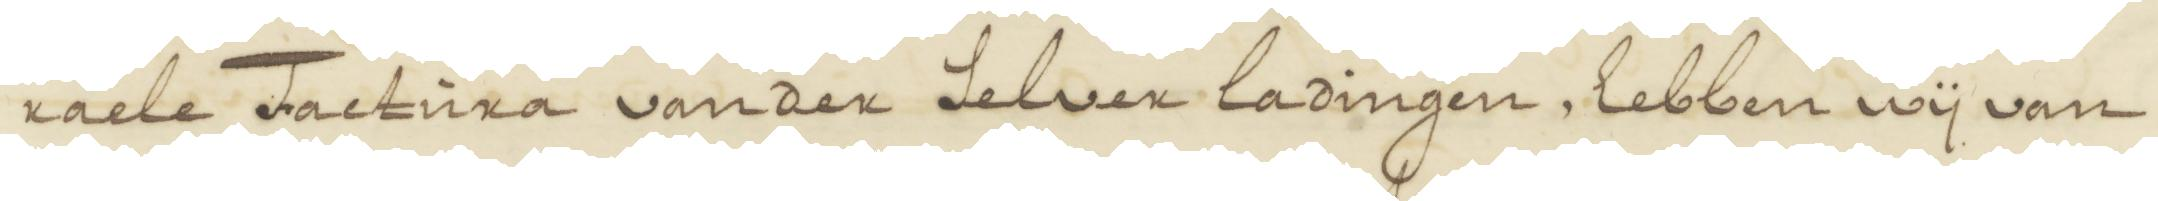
raele Factura van der selver ladingen, hebben wij van
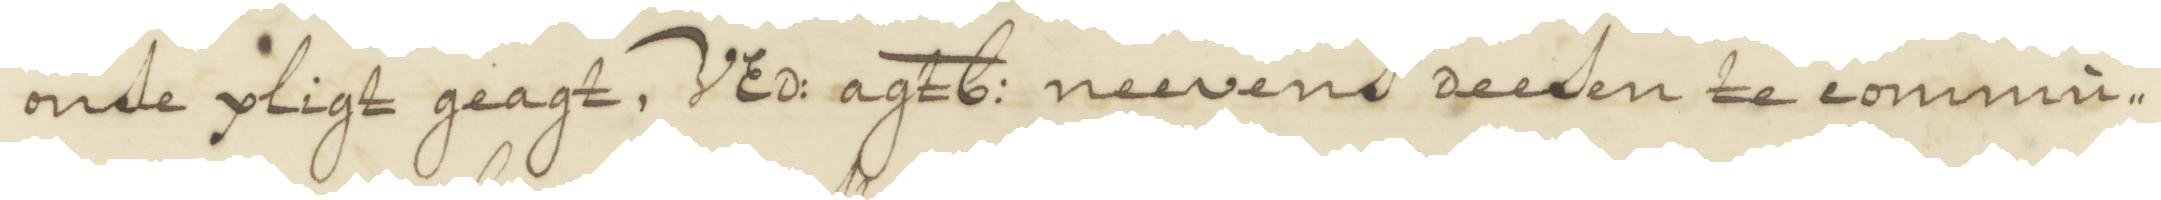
onse pligt geagt, VEd: agtb: neevens deesen te commu„
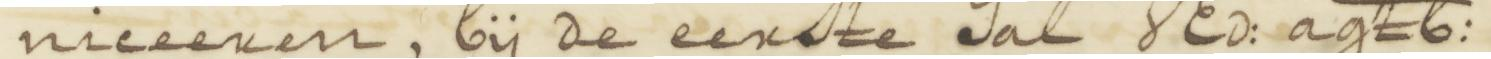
niceeren, bij de eerste sal VEd: agtb:
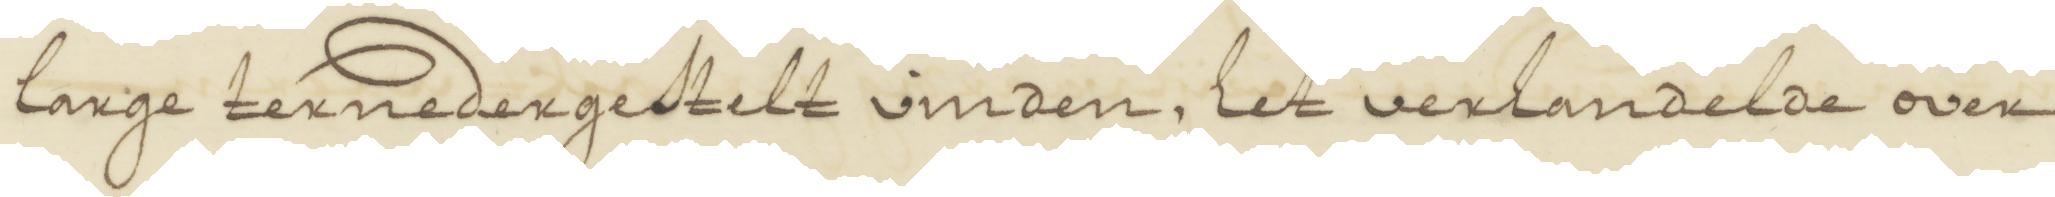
large ter nedergestelt vinden, het verhandelde over
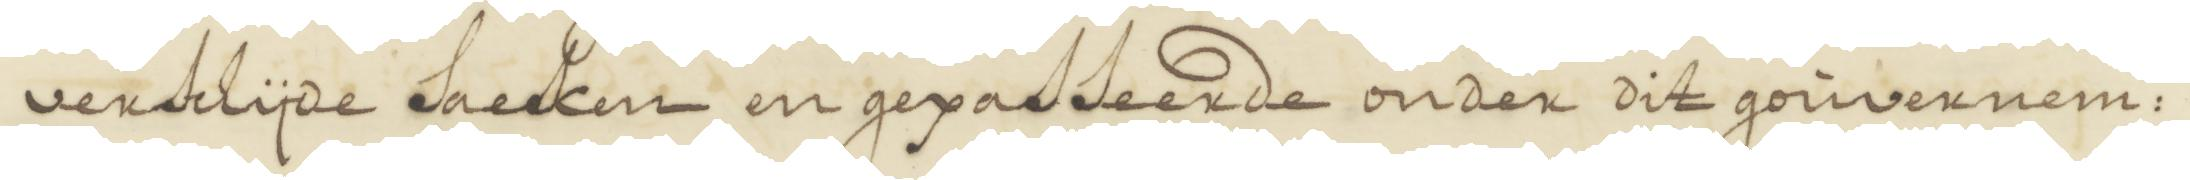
verschijde saeken en gepasseerde onder dit gouvernem:t
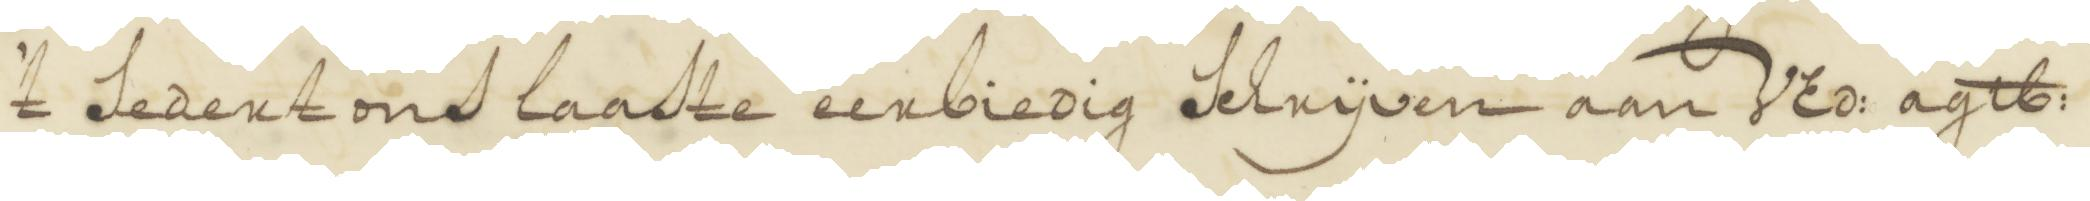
’t sedert ons laaste eerbiedig schrijven aan VEd: agtb:
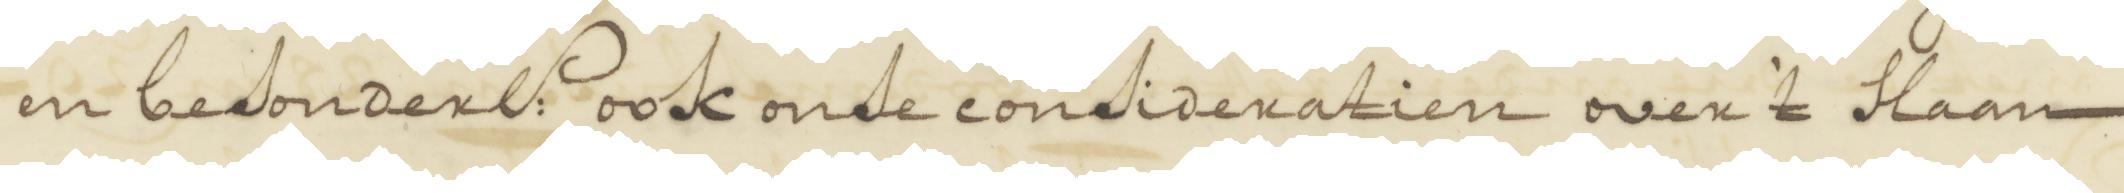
en besonderlijk ook onse consideratien over ’t slaan
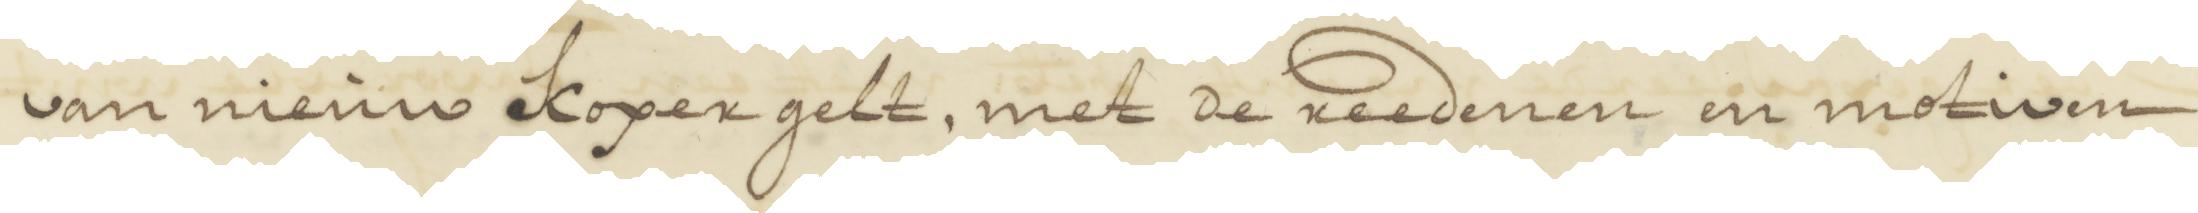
van nieuw koper gelt, met de reedenen en motiven
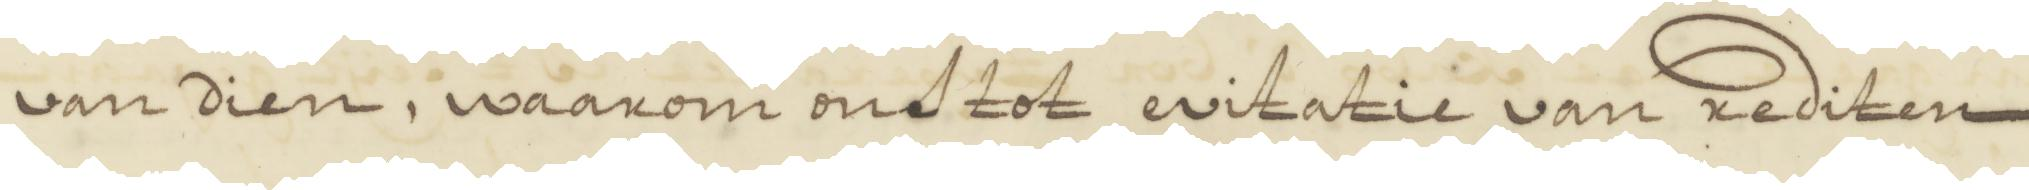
van dien, waarom ons tot evitatie van rediten
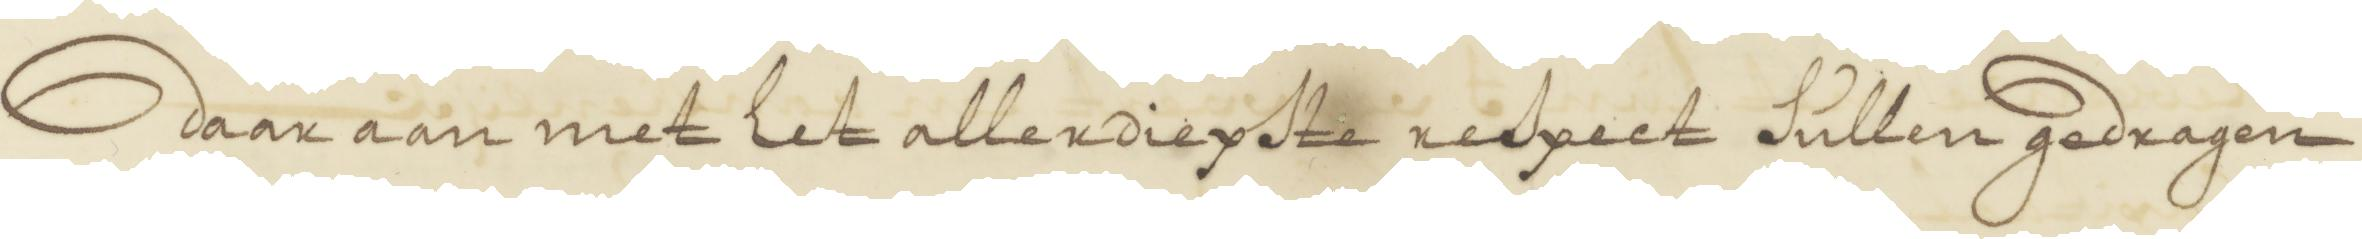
daar aan met het allerdiepste respect sullen gedragen
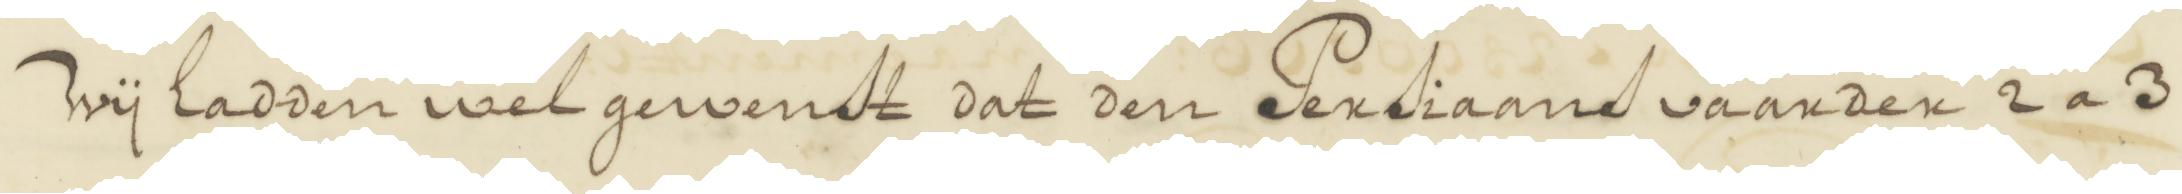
Wij hadden wel gewenst dat den Persiaans vaarder 2 a 3
